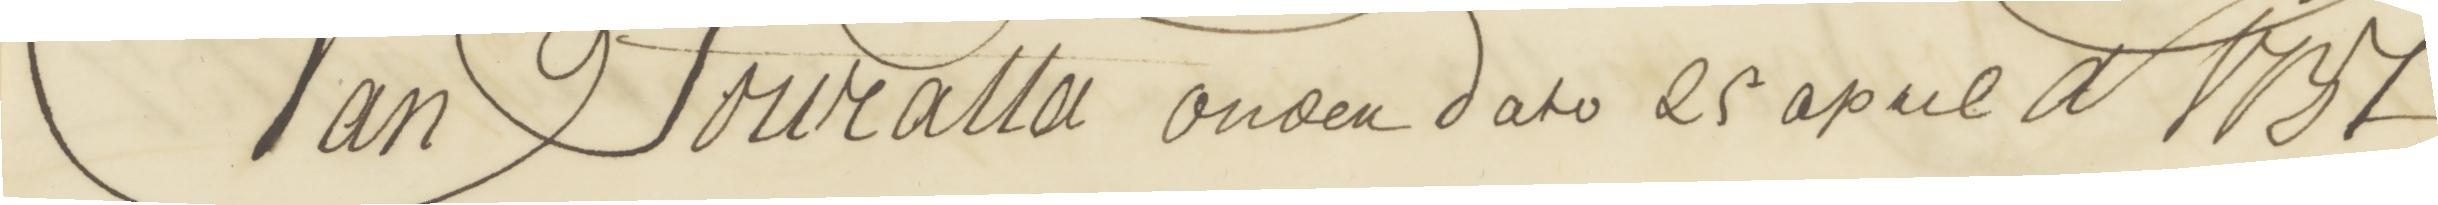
Van Souratta onder dato 25 april Ao 1737—
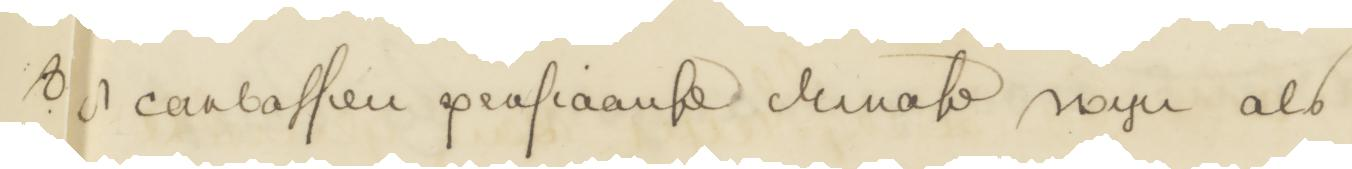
8 carbassen persiaanse chinase wyn als
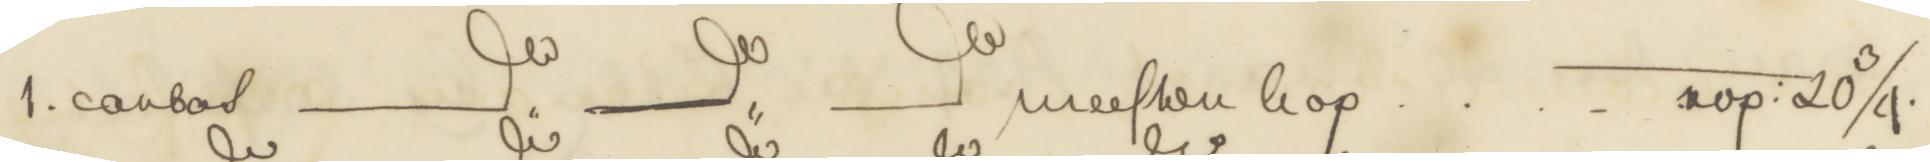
1. carbas d„o d„o do meesten kop - - - - rop: 20¾.
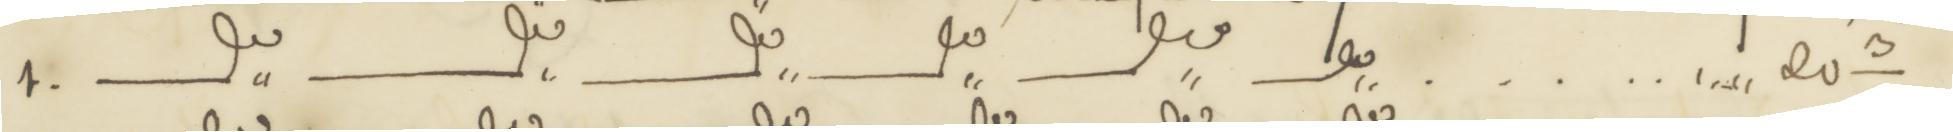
1. d„o d„o d„o d„o d„o d„o - - - - - - - - „ 20¾
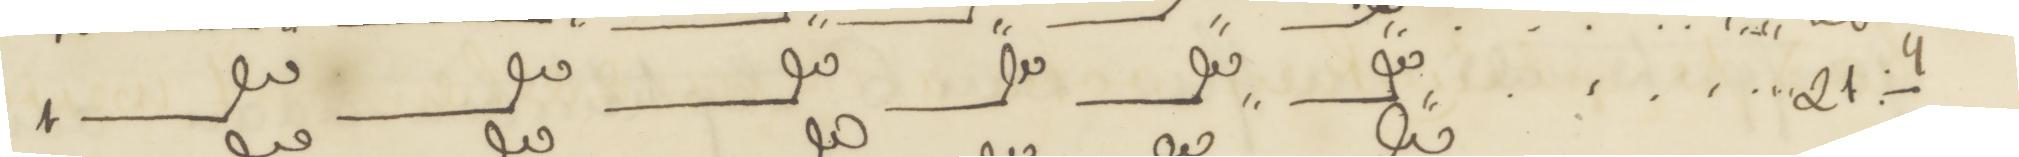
1 do do do do d„o d„o - - - - - „ 21: —
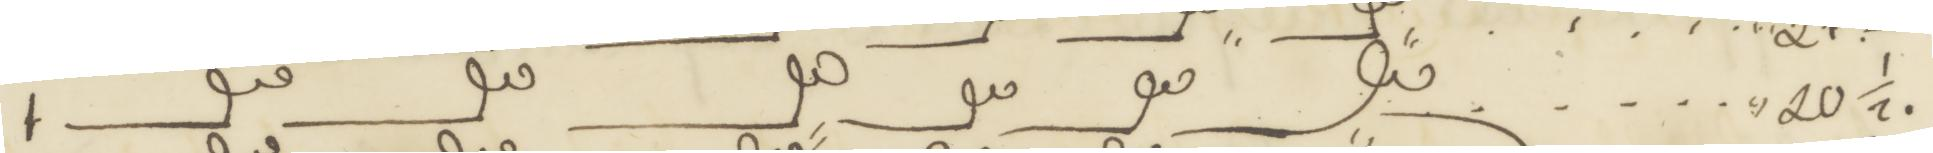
1 do do d„o do do d„o - - - - - „ 20½.
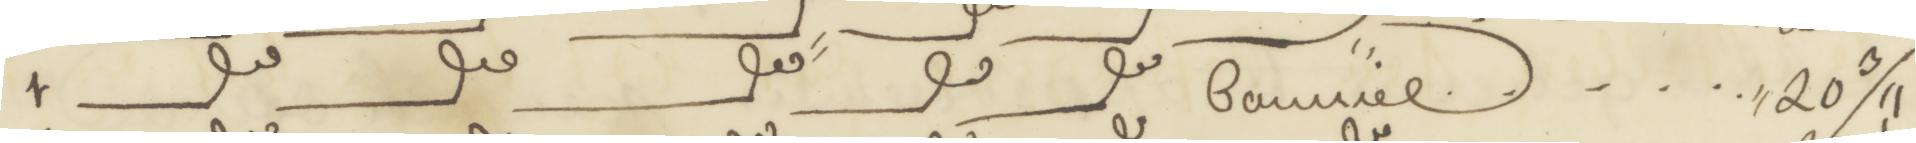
1 do do do do do banniel - - - - - - „ 20 3/11
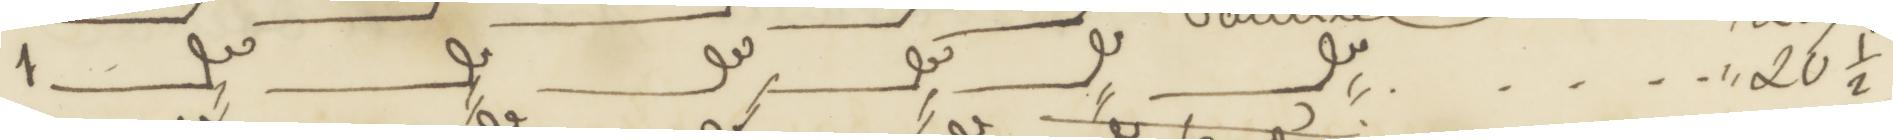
1 d„o d„o d„o d„o d„o d„o - - - - - „ 20½
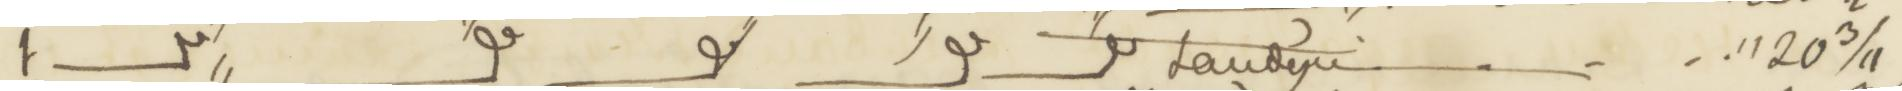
1 d„o do do do do tandyn - - - - - „ 20 3/11
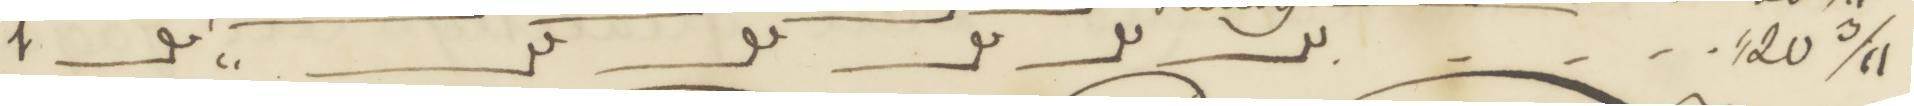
1 d„o do do do do do - - - - - „ 20 3/11
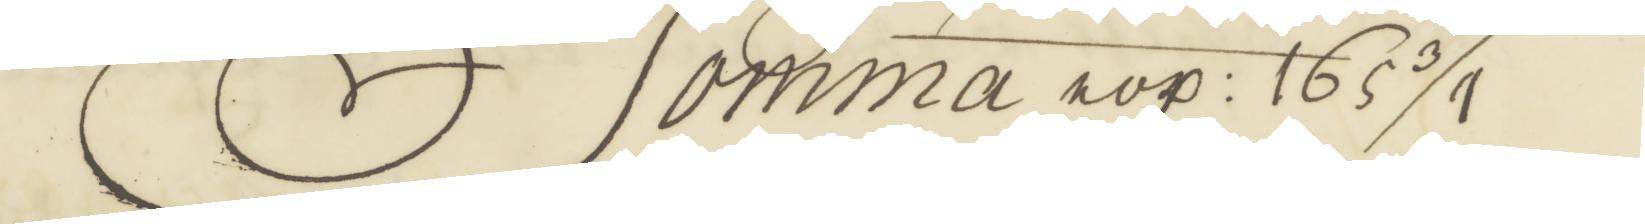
Somma rop: 165¾
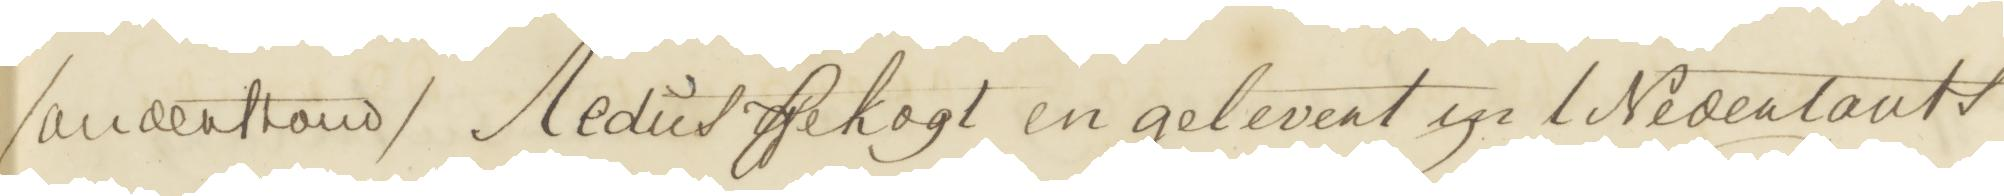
/onderstond/ Aldus gekogt en gelevert in t Nederlants
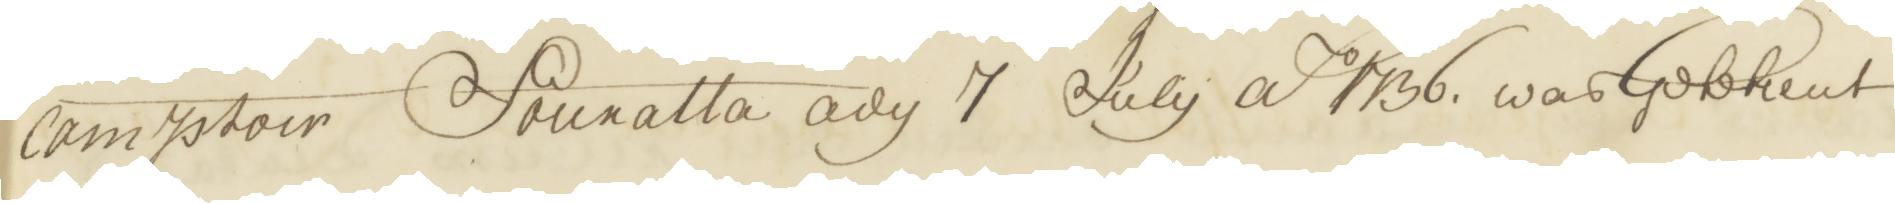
Camptoir Souratta ady 7 Iulij ao 1736. was Getekent
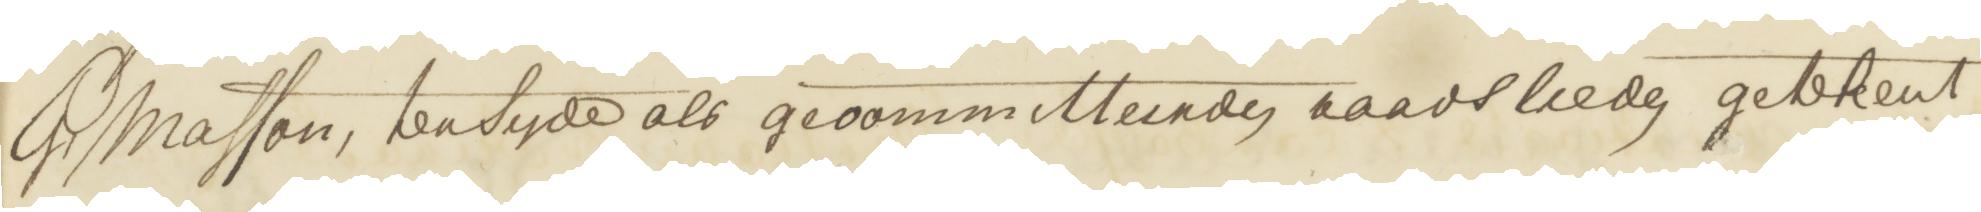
G, Masson, tersyde als gecommitteerden raadslieden getekent
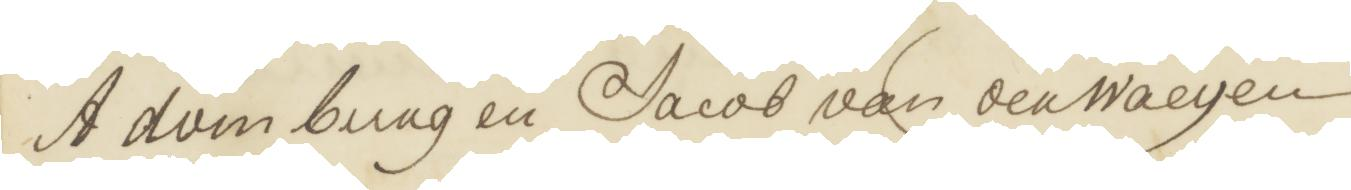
A domburg en Iacob van der waeyen
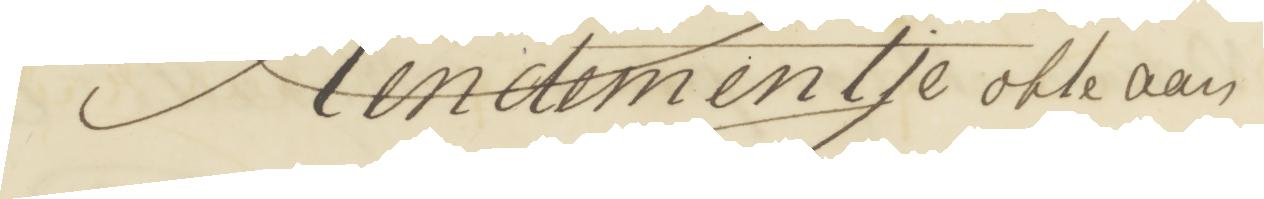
Rendementje ofte aan
